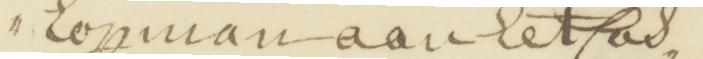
„hopman aan het Cas„
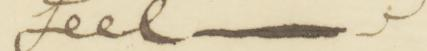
teel —
